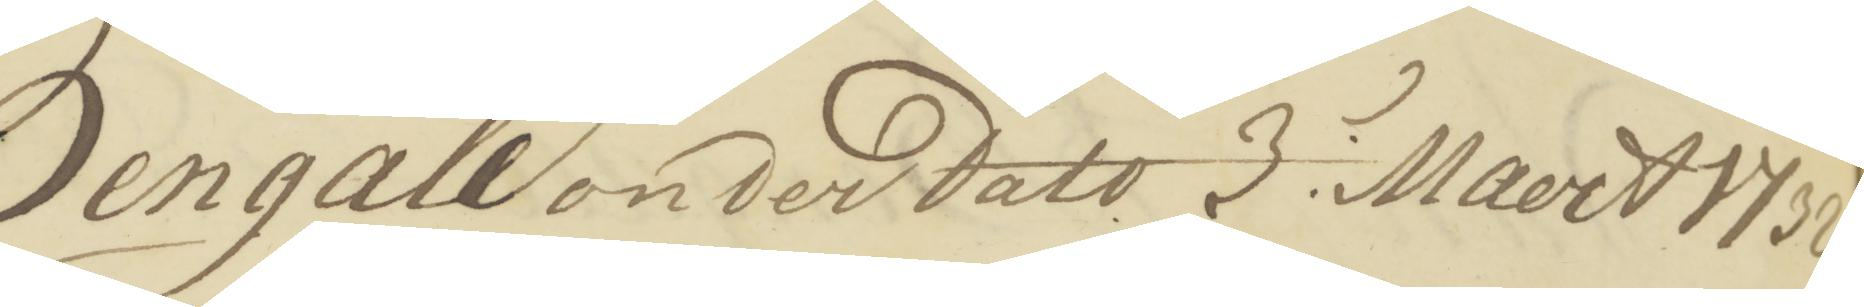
Van Bengale onder dato 3:' Maert 1732
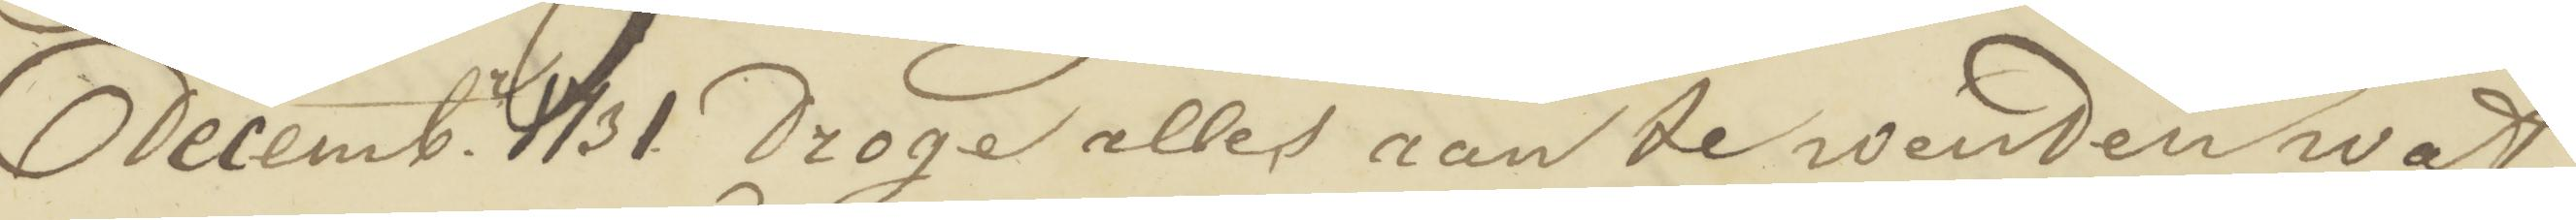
decemb: 1731. droge alles aan de wenden wat
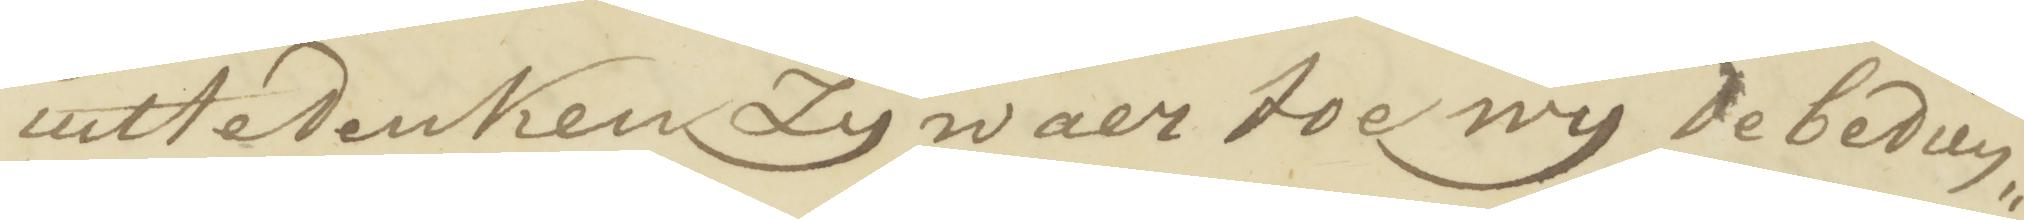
uit te denken Zij waer toe wij de bedien„
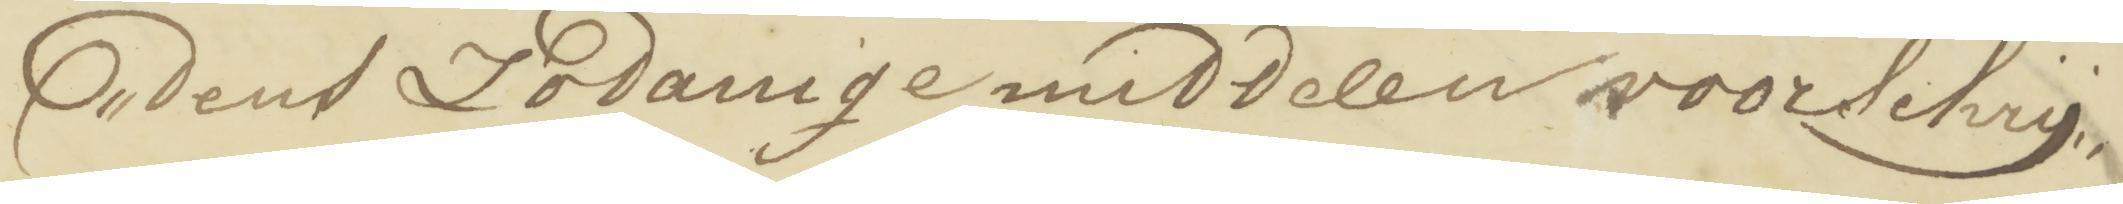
dens Zodanige middelen voorschrij„
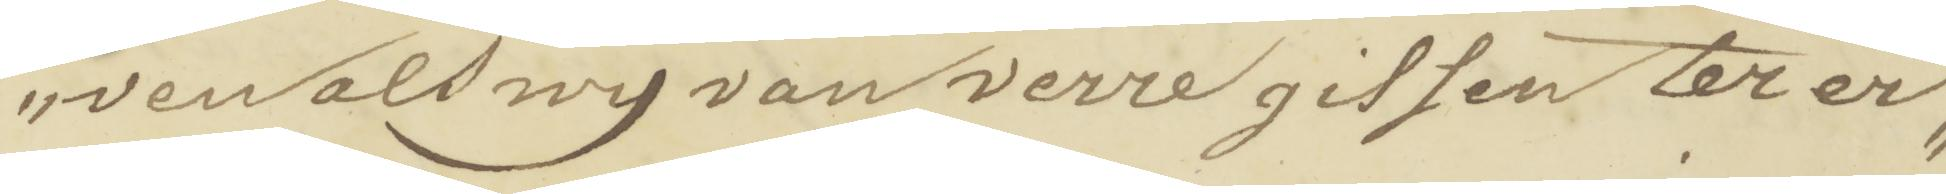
„ven als wij van verre gissen ter er„
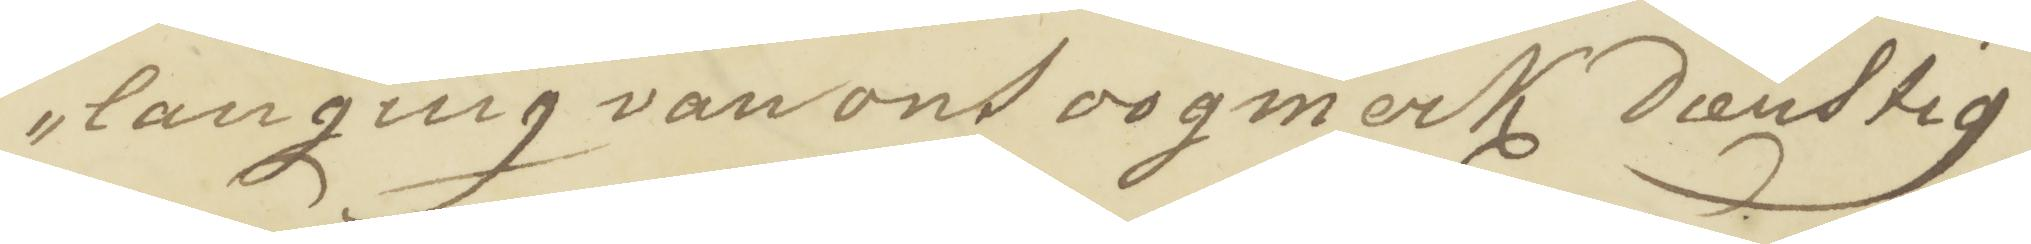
„langing van ons oogmerk dienstig
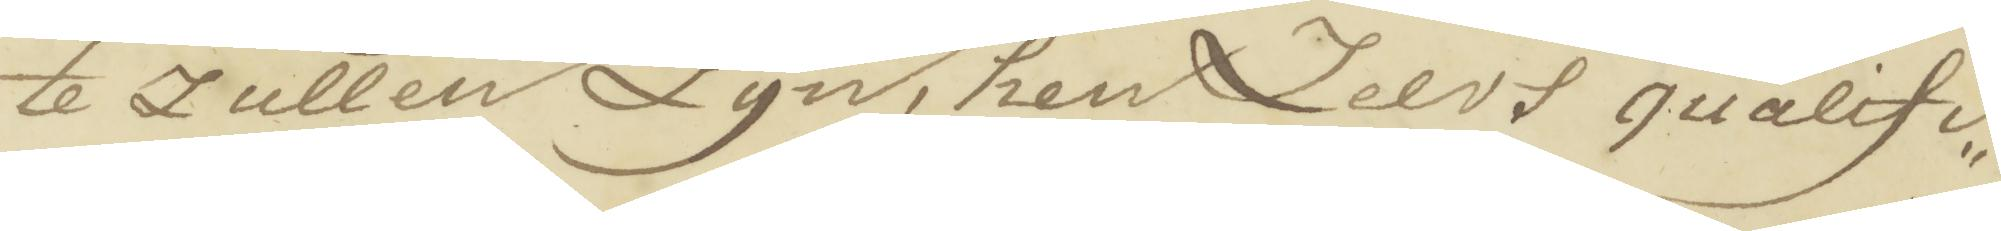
te Zullen Zijn, hen Zelvs qualifi„
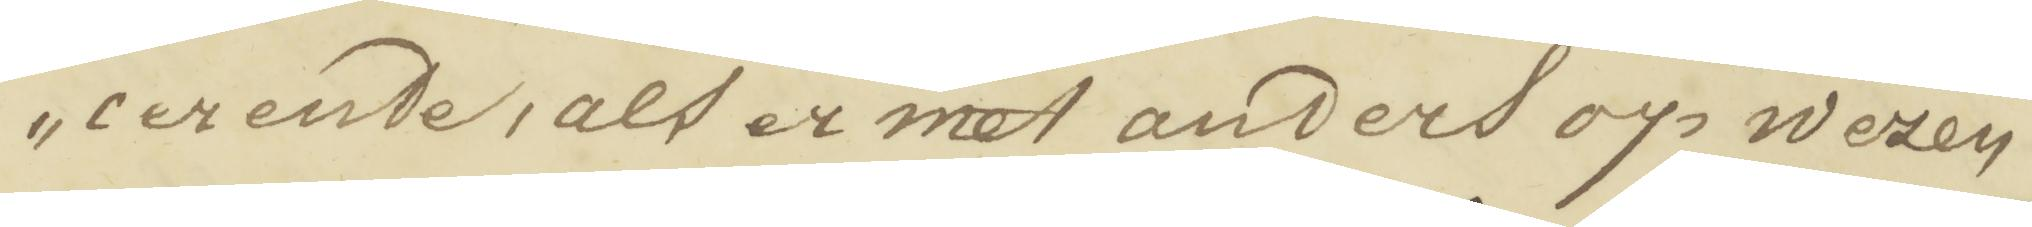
„cerende, als er niet anders op wezen
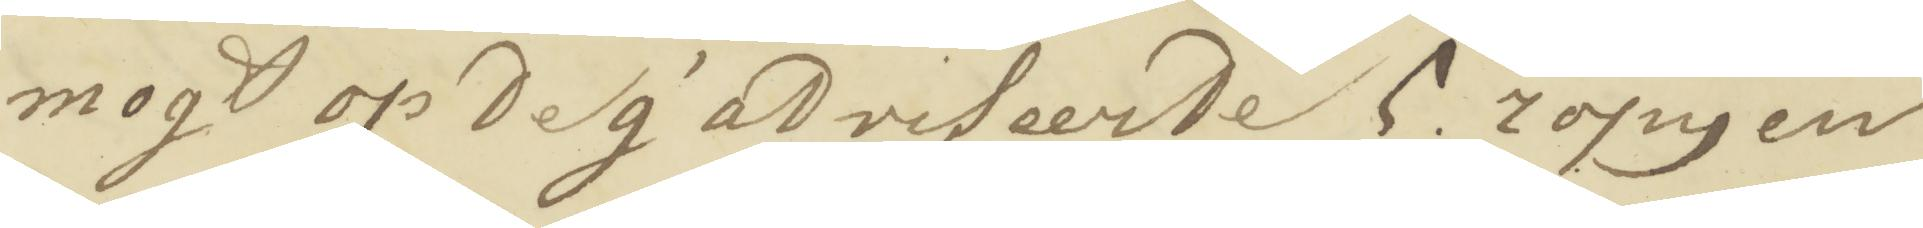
mogt op de g’adviseerde 5. ropijen
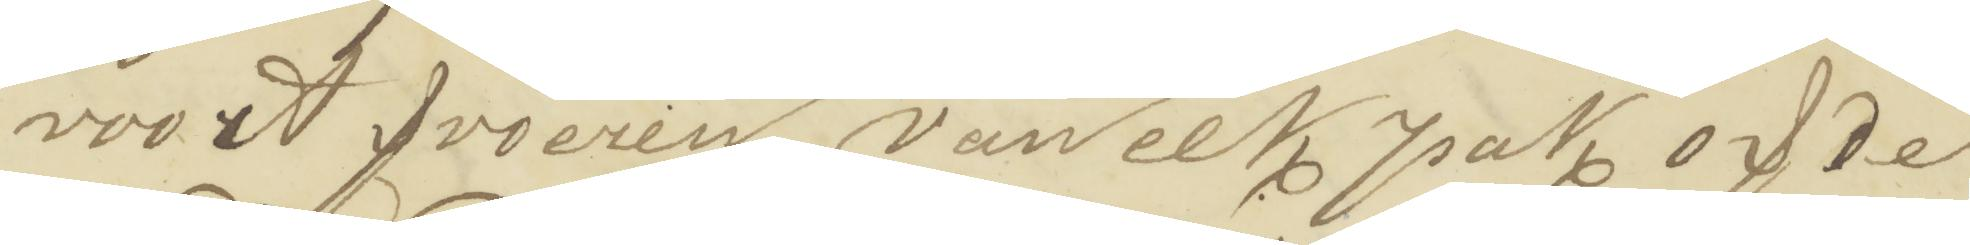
voor t vervoeren van elk pak over de
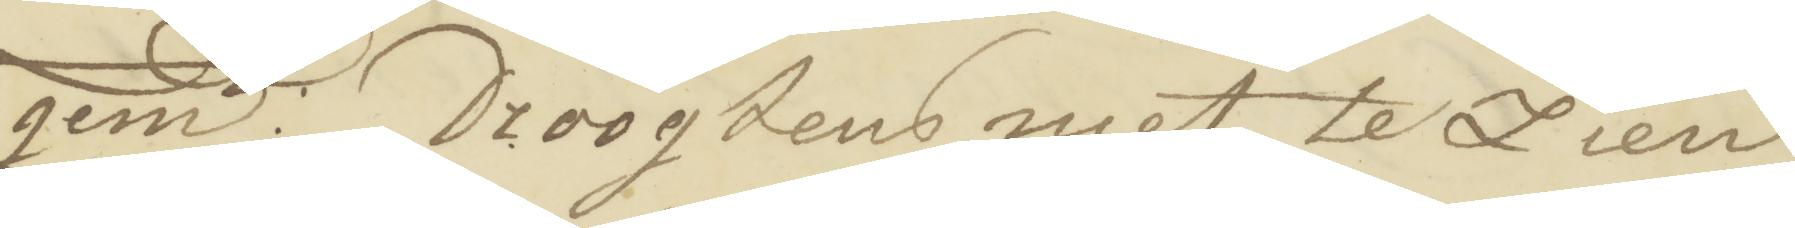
gem:t droogtens niet te Zien
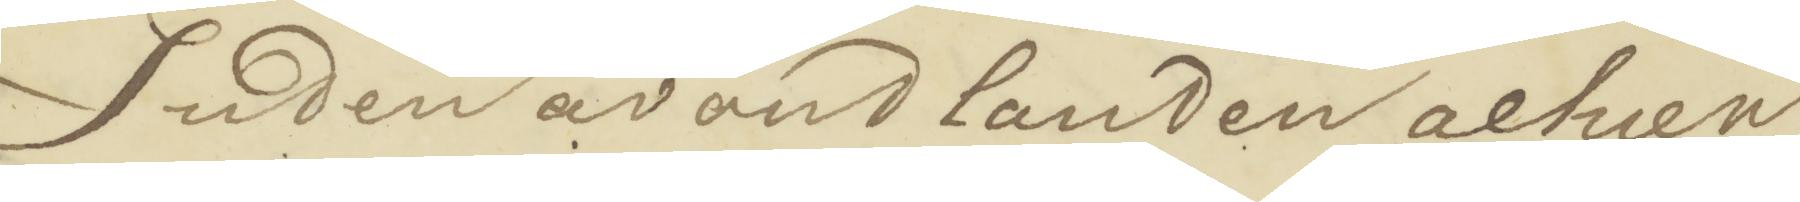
In den avondlanden alhier
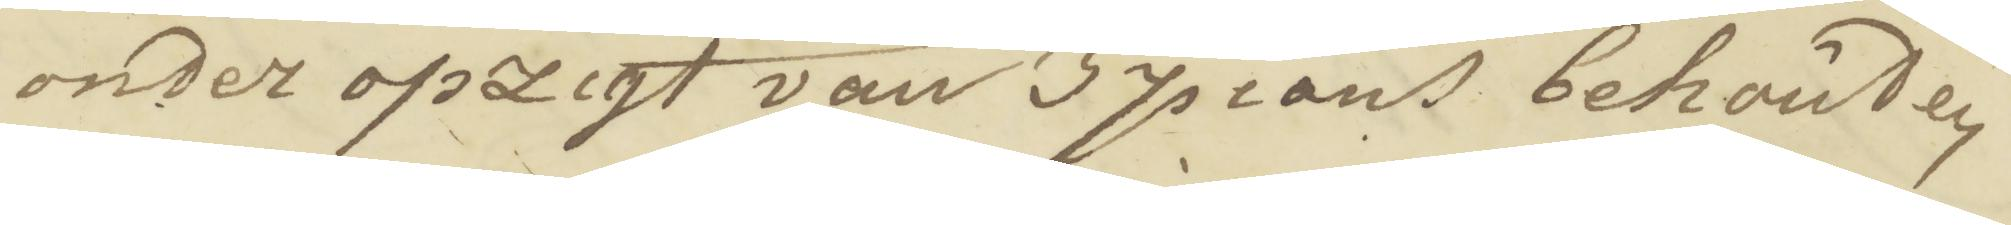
onder opzigt van 3 pians behouden
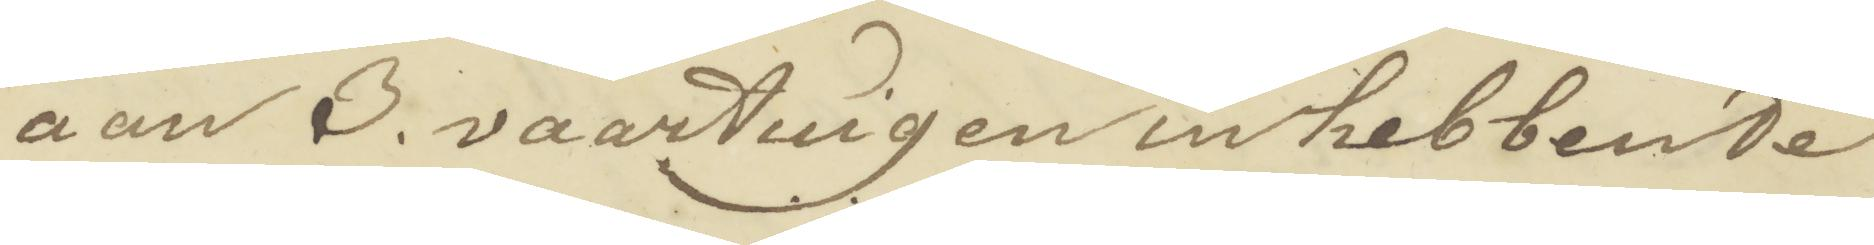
aan E. vaartuigen in hebben de
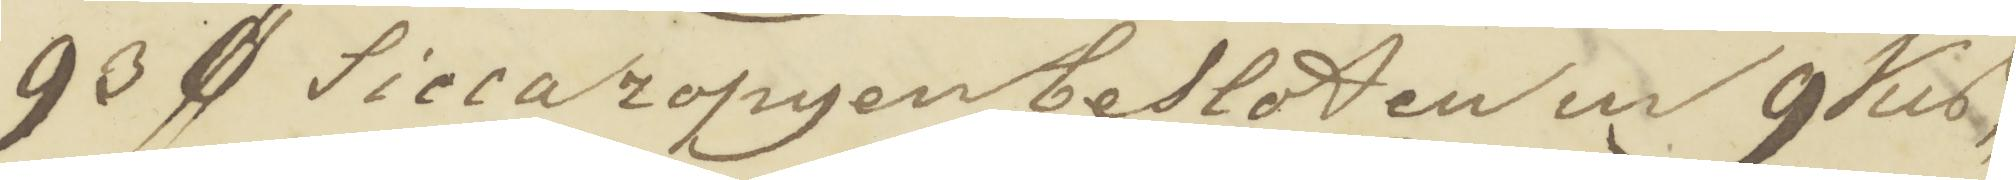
93 Ø Sicca ropijen besloten in 9 kis„
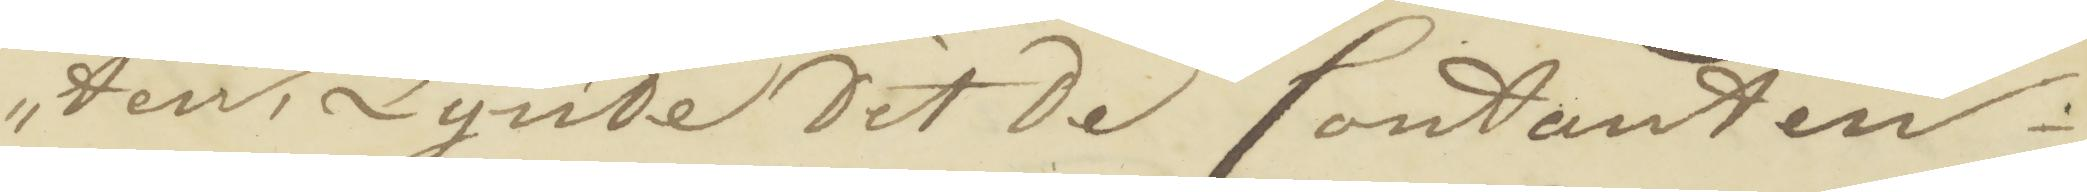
„ten, Zijnde dit de Contanten
